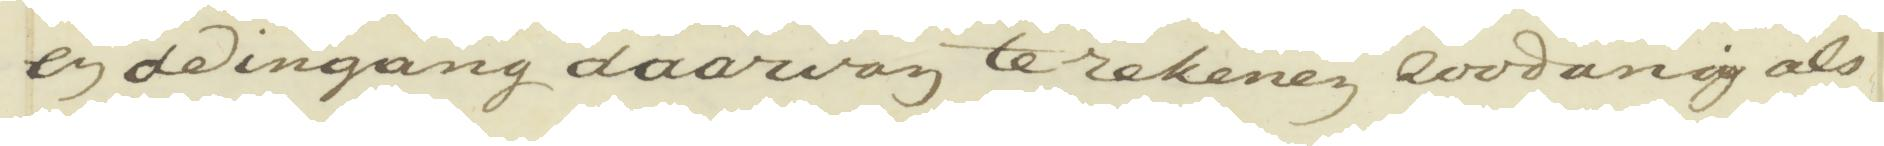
en de ingang daarvan te rekenen zoodanig als
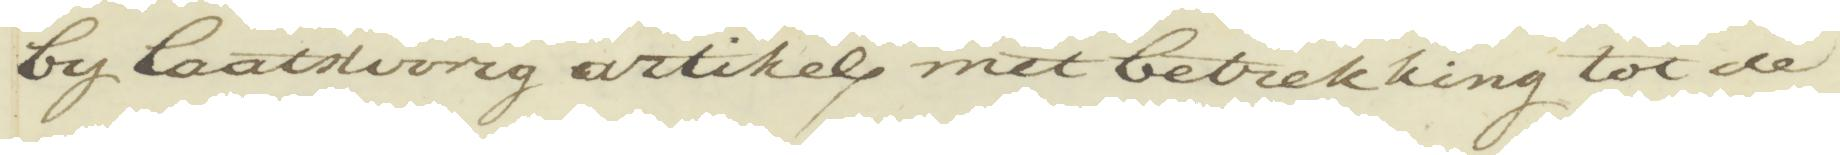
by laatstvorig artikel met betrekking tot de
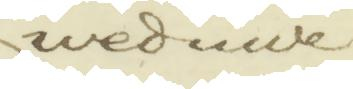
weduwe
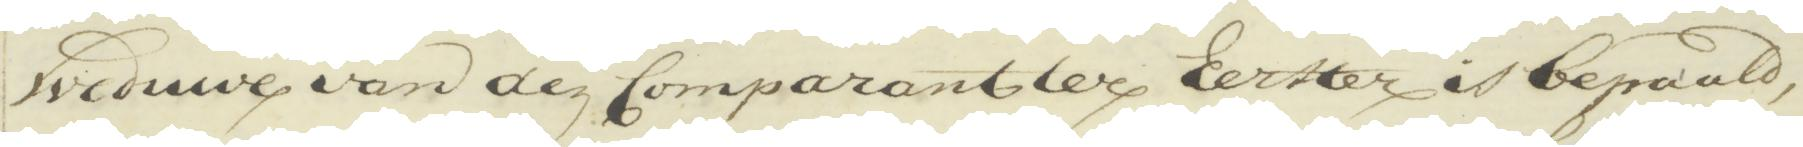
weduwe van den Comparant ter Eerster is bepaald,
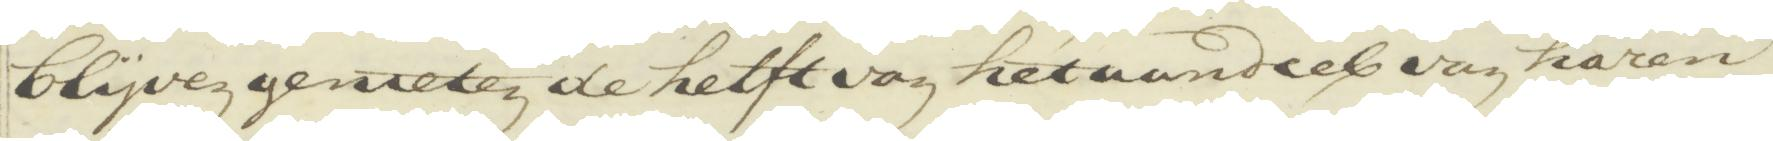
blijven genieten de helft van het aandeel van haren
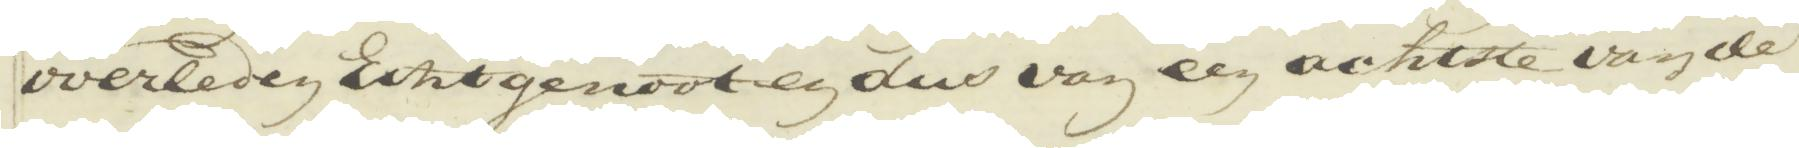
overleden Echtgenoot en dus van een achtste van de
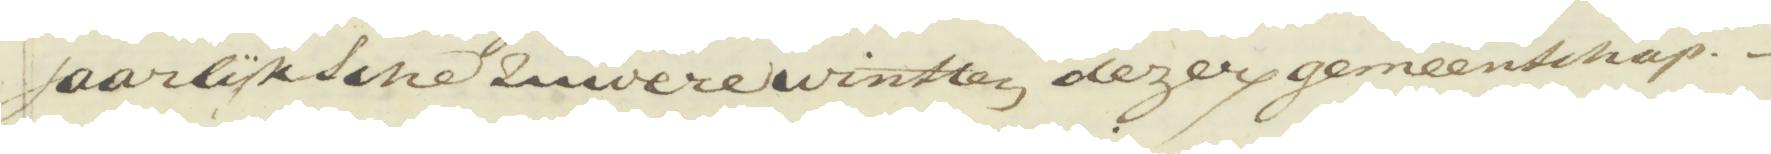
jaarlijksche zuivere winsten dezer gemeenschap. —
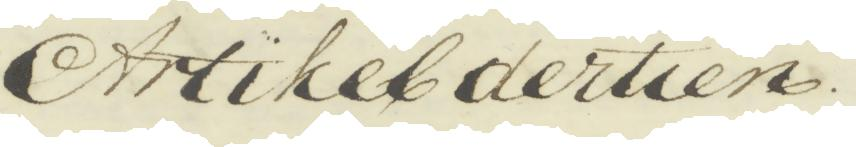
Artikel dertien.
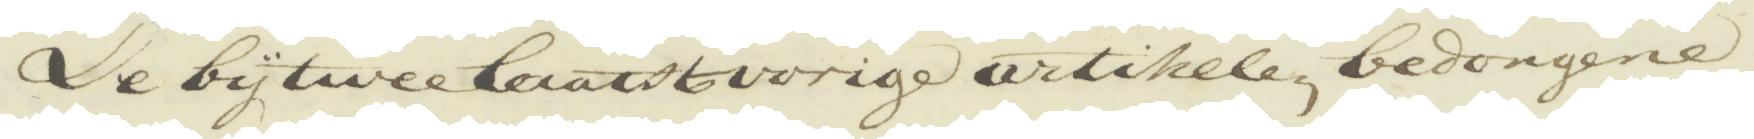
De bij twee laatstvorige artikelen bedongene
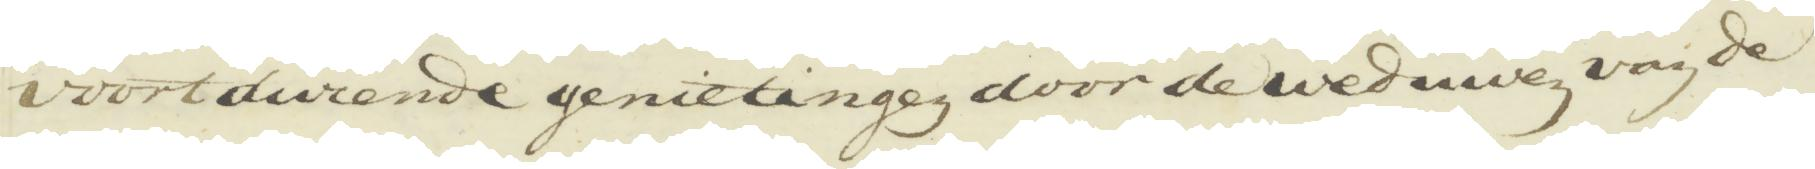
voortdurende genietingen door de weduwe van de
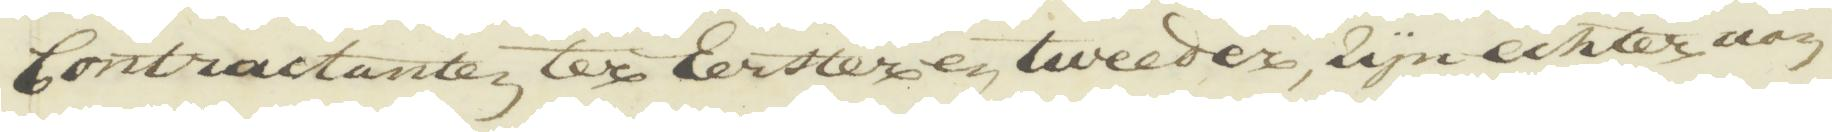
Contractanten ter Eerster en tweeder, zijn echter aan
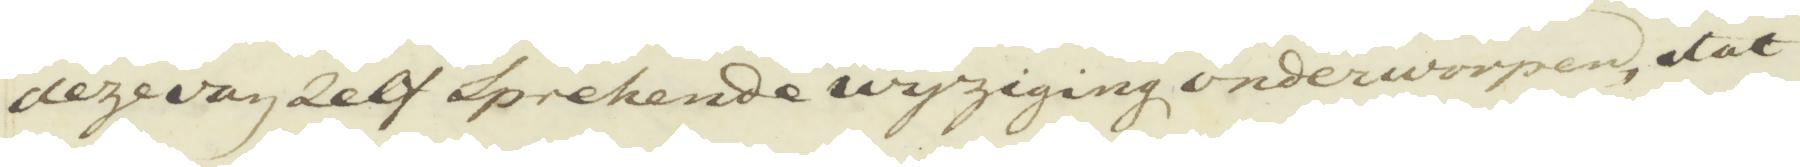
deze van zelf sprekende wijziging onderworpen, dat
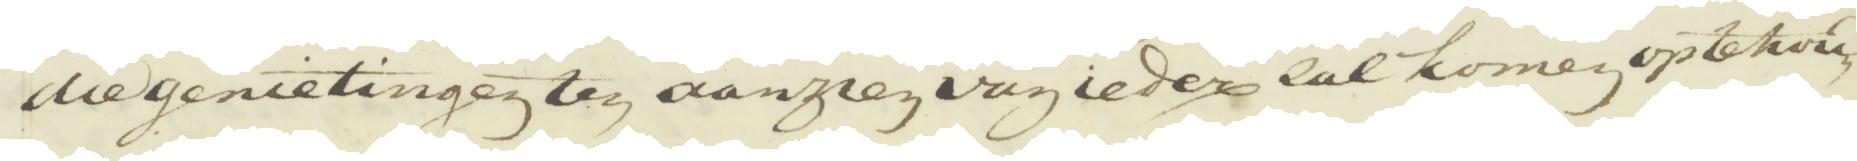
die genietingen ten aanzien van ieder zal komen op tehou„
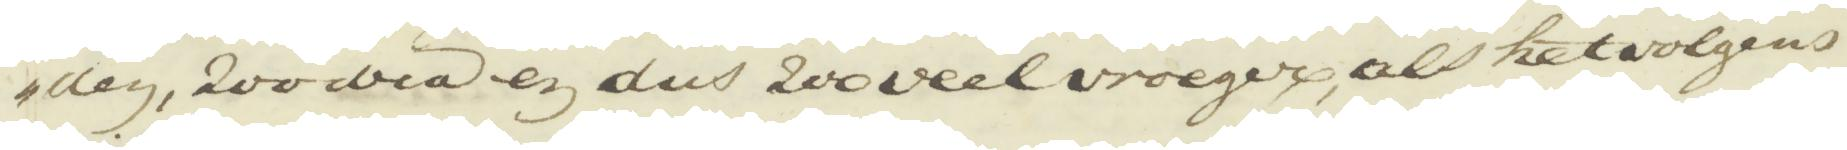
„den, zoo dra en dus zoo veel vroeger, als het volgens
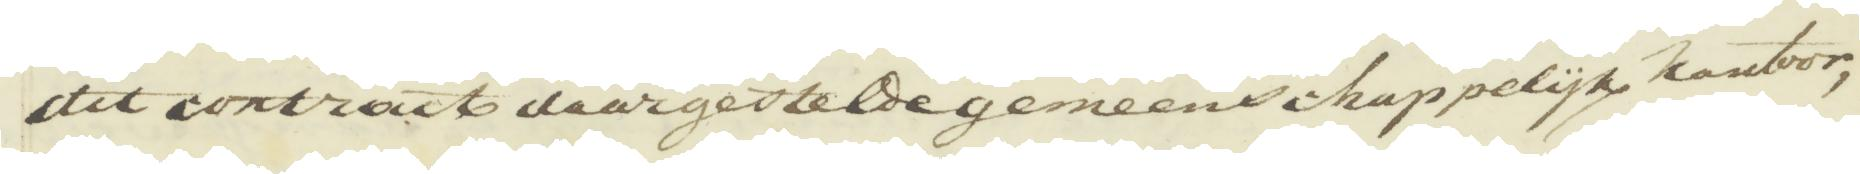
dit contract daargestelde gemeenschappelijk kantoor,
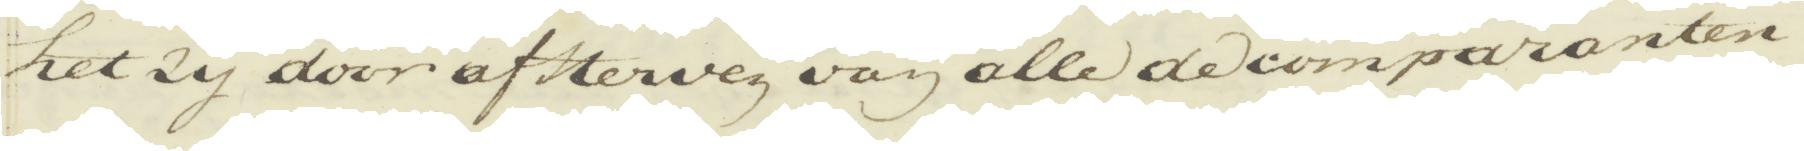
het zij door afsterven van alle de comparanten
